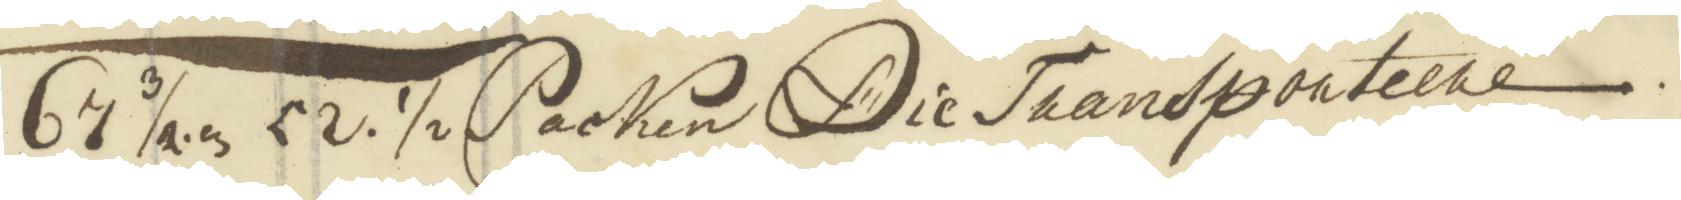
67 3/4. en 52. ½ Packen Die Transporteere.
